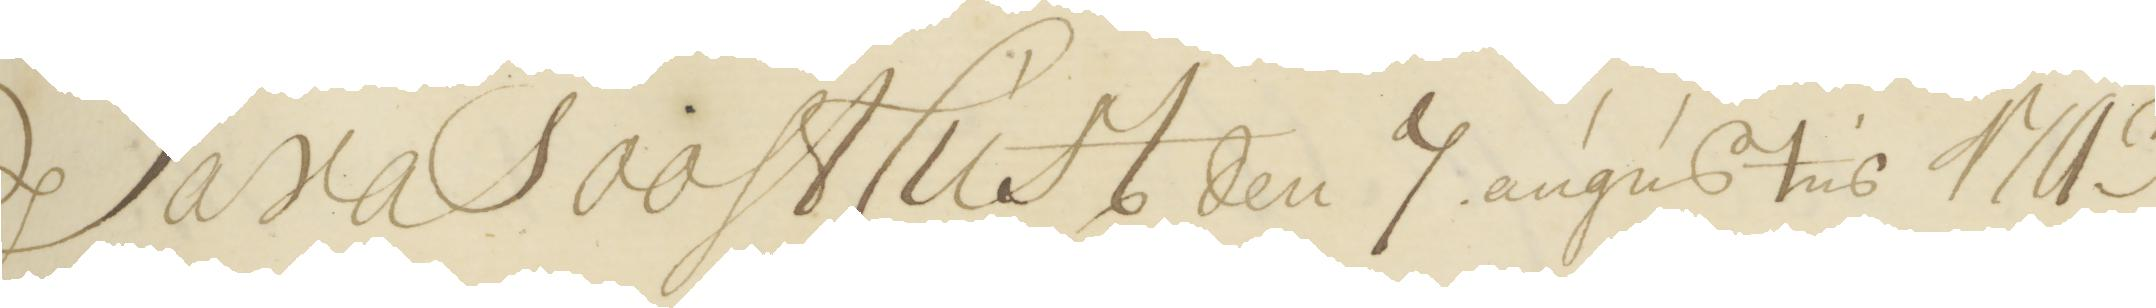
Java S oost Cust den 7. augustus 1743
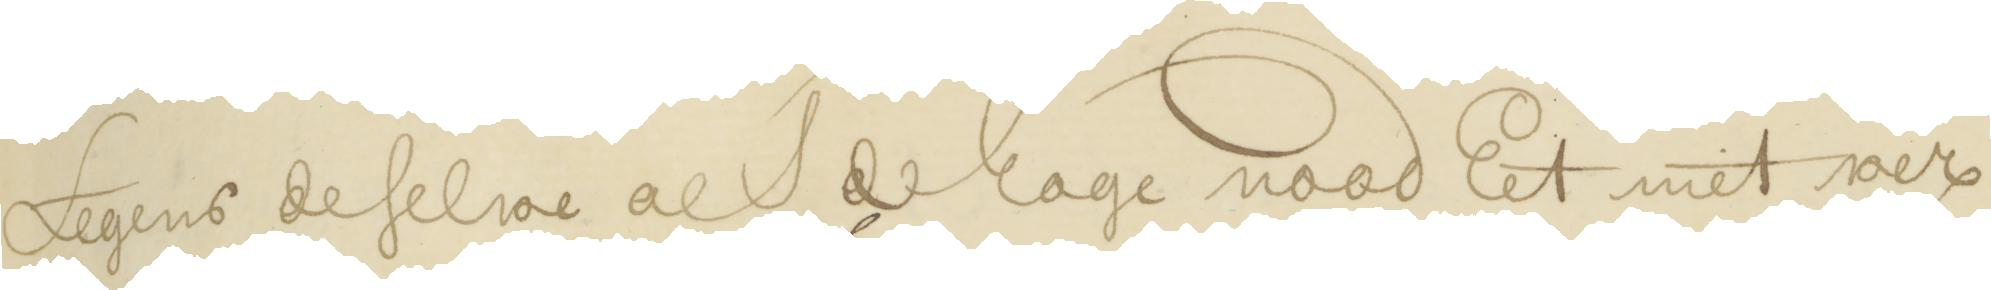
tegens deselve als de hoge nood het niet ver
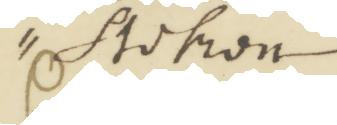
„steken
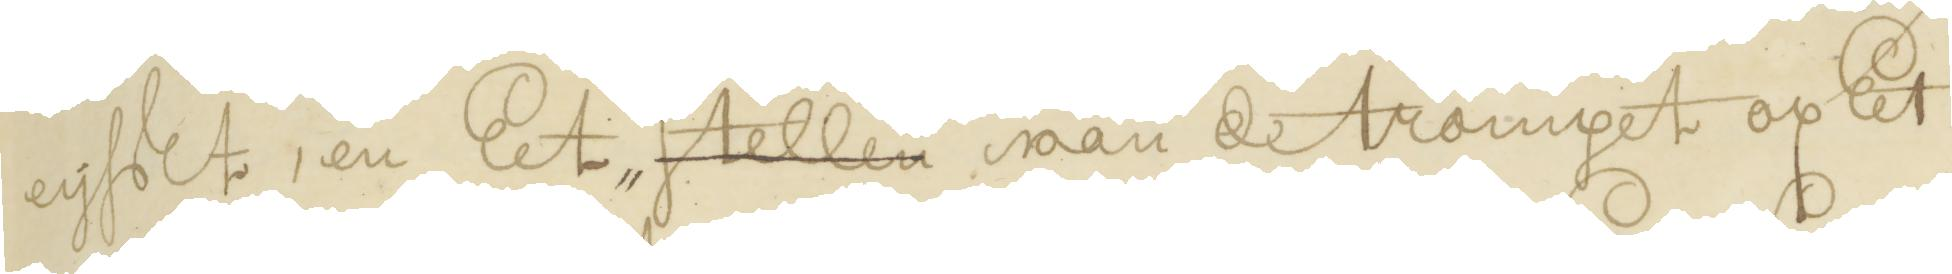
eijscht, en het „ stellen van de trompet op het
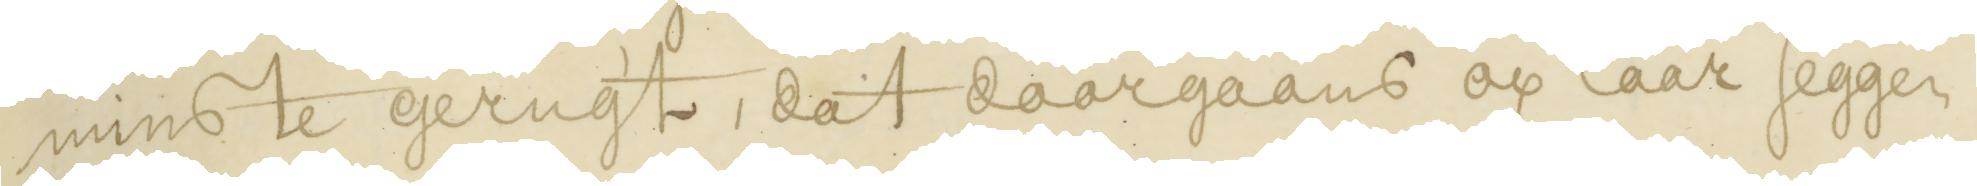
minste gerugt, dat doorgaans op haar seggen
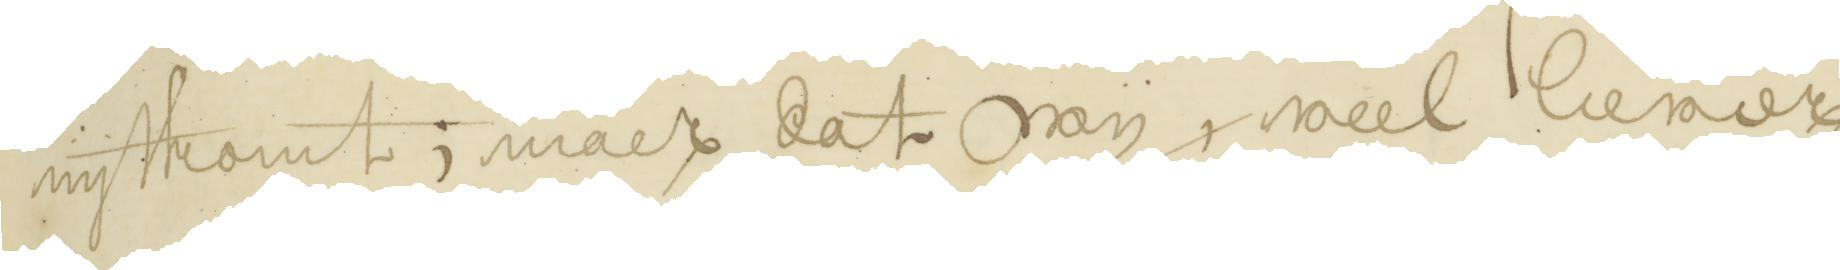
uijtkomt; maer dat wij, veel liever
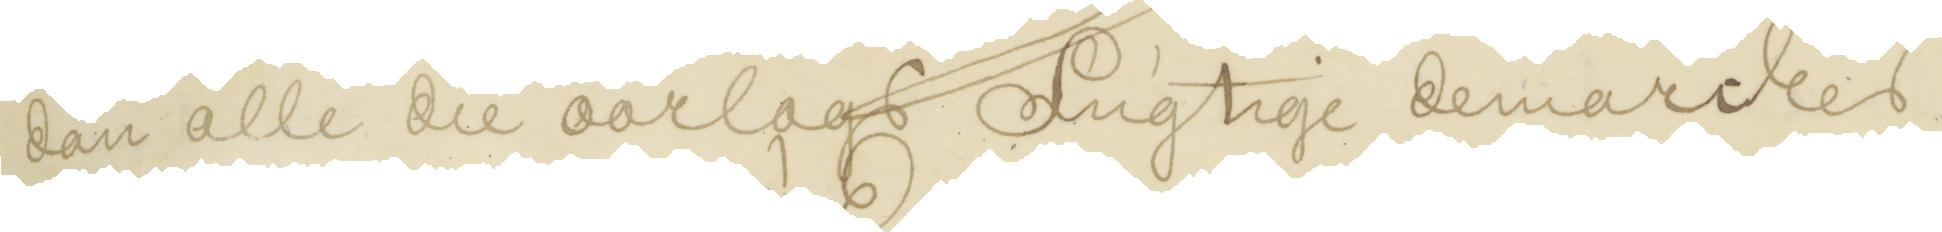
dan alle die oorlogs Lugtige demarches
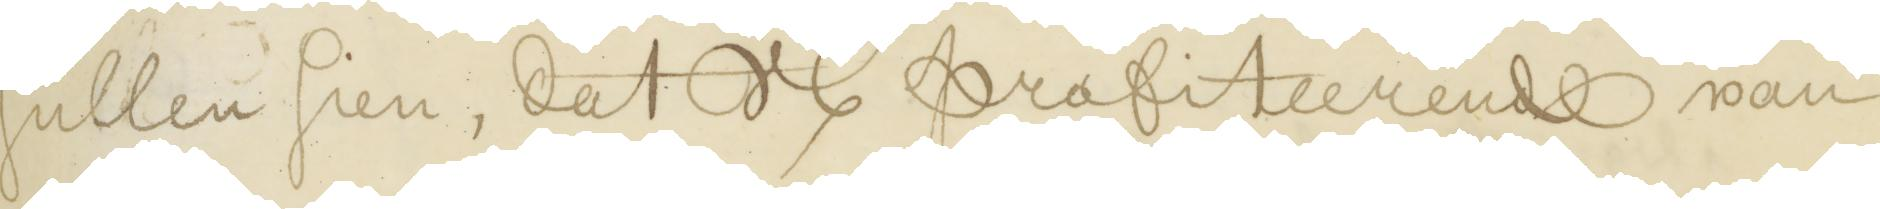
Sullen Sien, dat UE profiteerende van
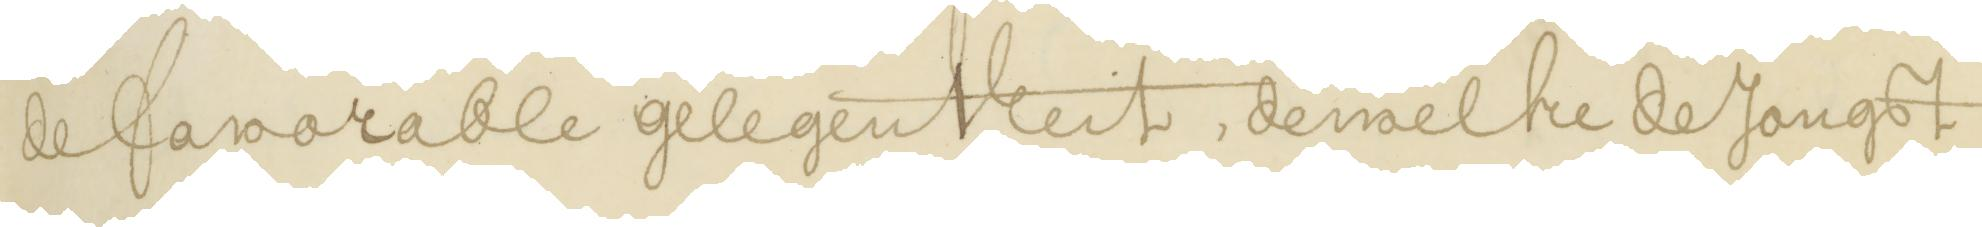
de favorable gelegentheit, dewelke de Jongst
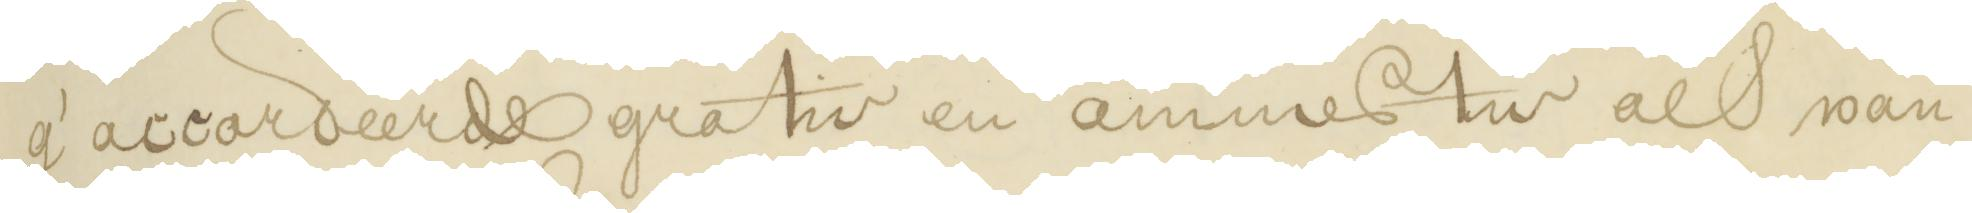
g’accordeerde gratie en amnestie als van
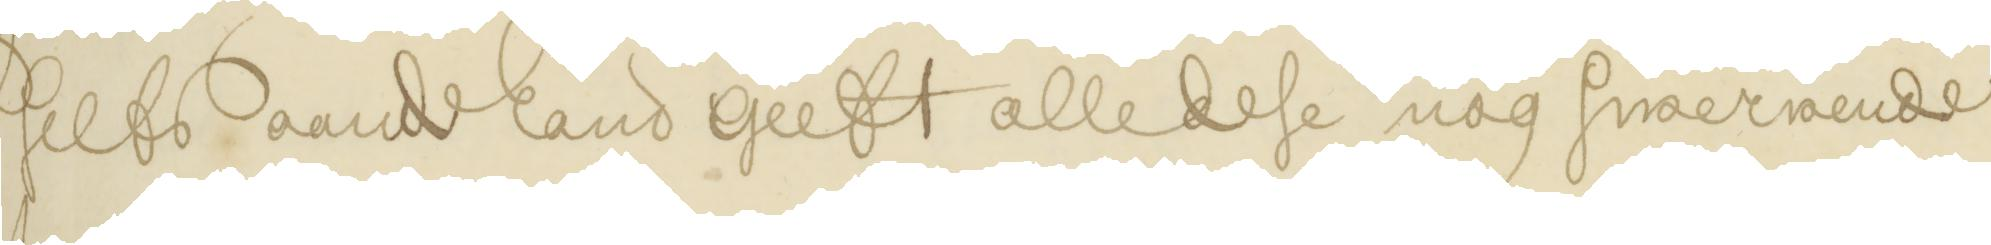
selfs aande hand geeft alle dese nog swerwende
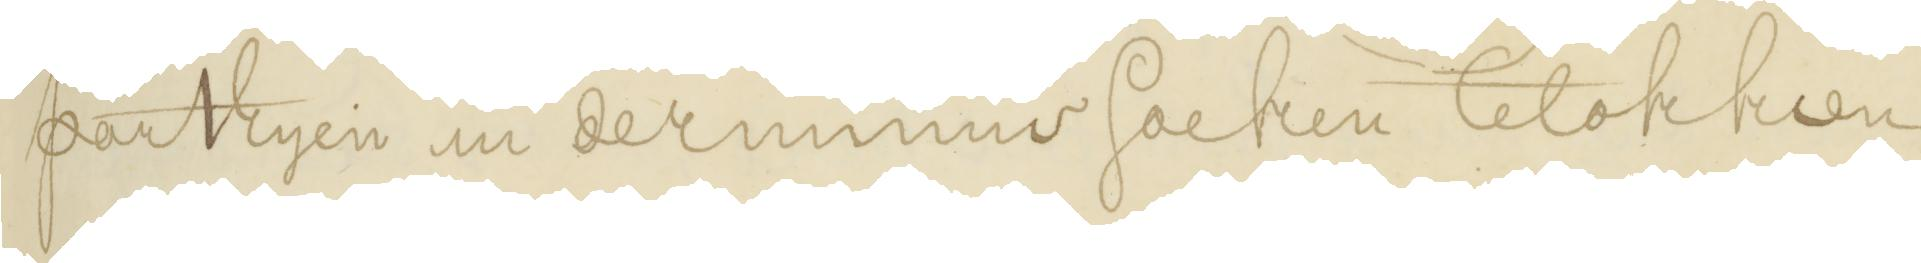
parthyen in derminne soeken telokken
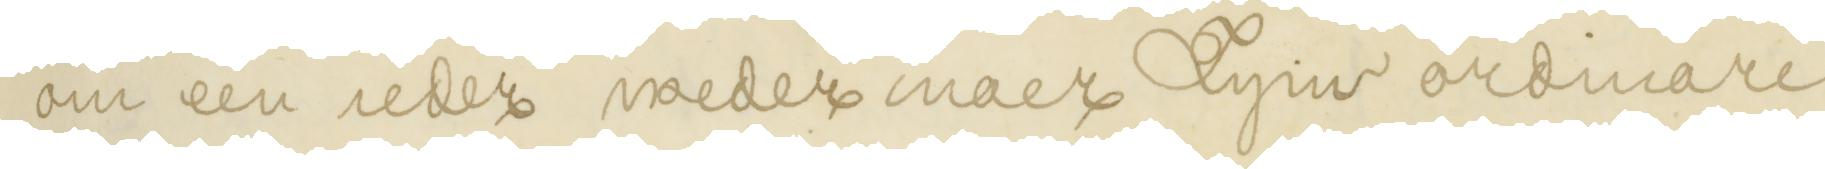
om een ieder weder naer Zyne ordinare
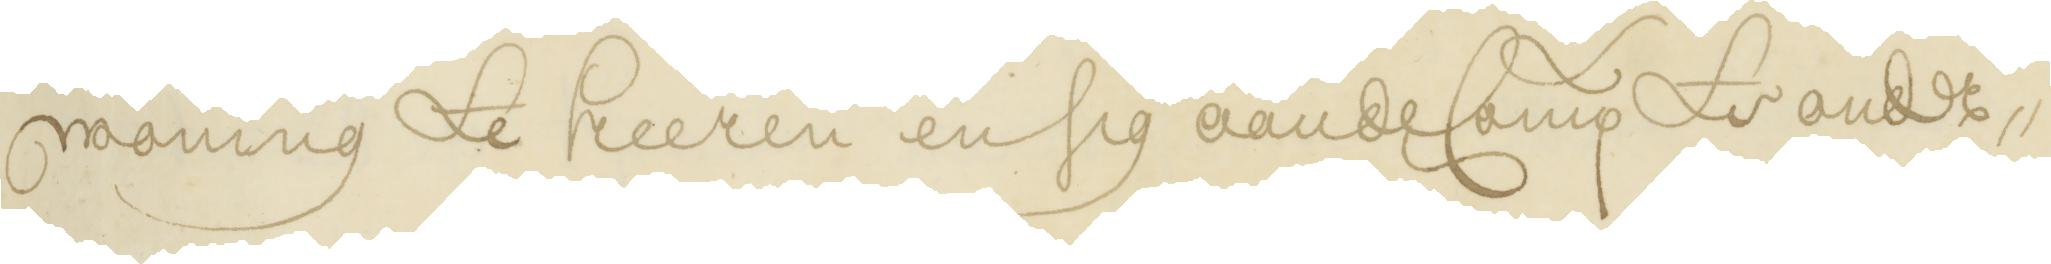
woning Te keeren en sig aan de Comp Te onder„
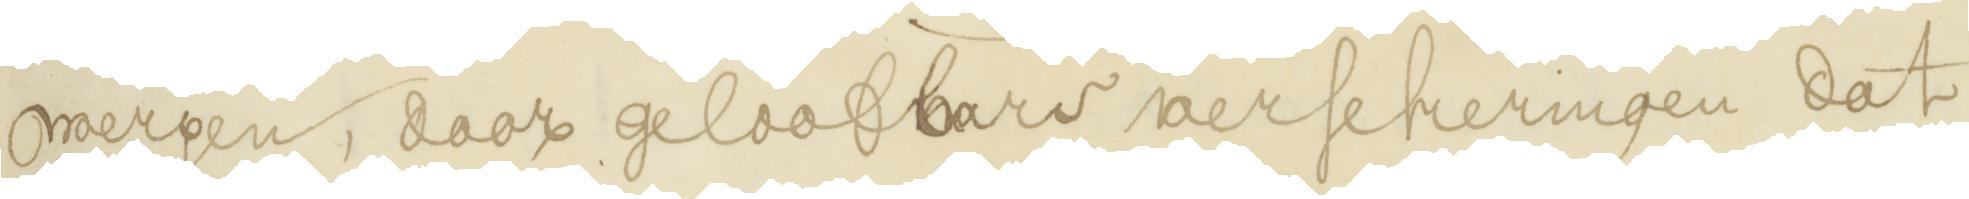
werpen, door geloofbare versekeringen dat
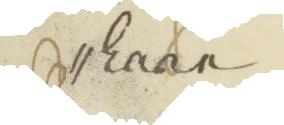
„haar
